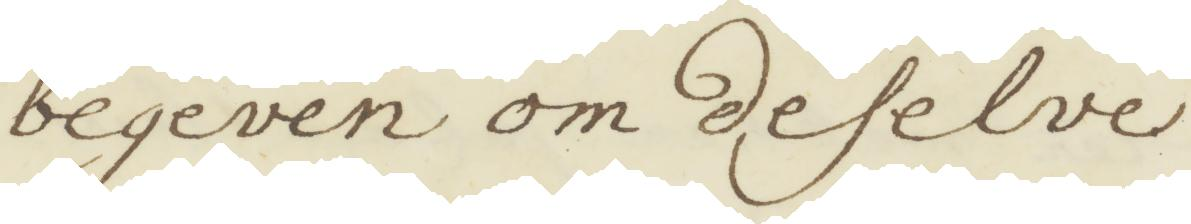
begeven om deselve
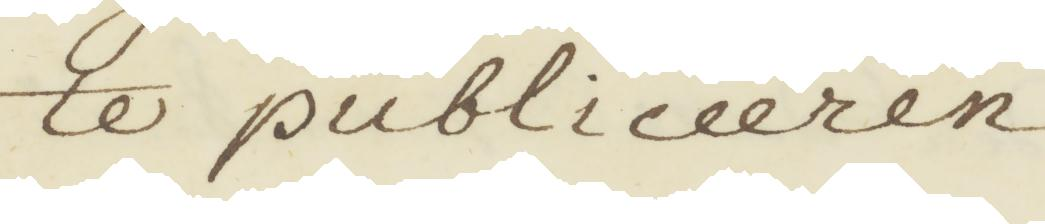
te publiceeren
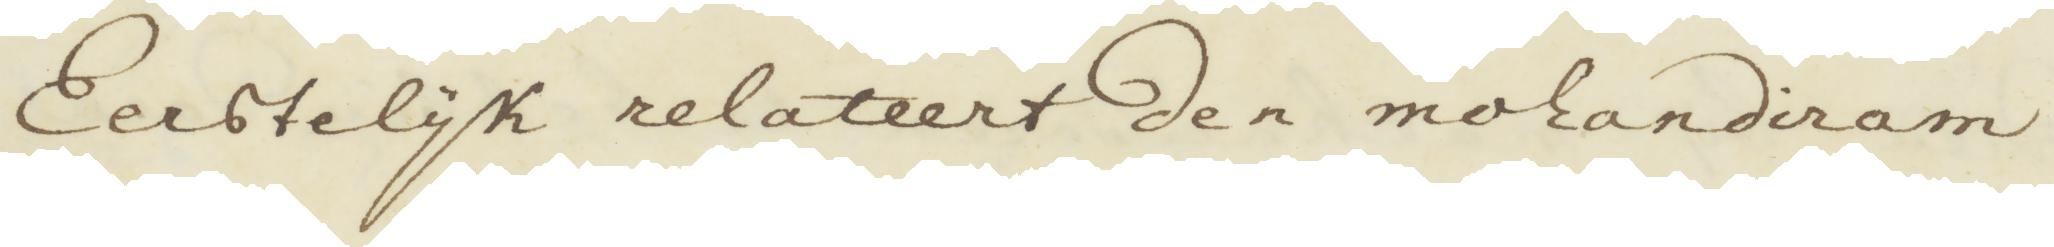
Eerstelijk relateert den mohandiram
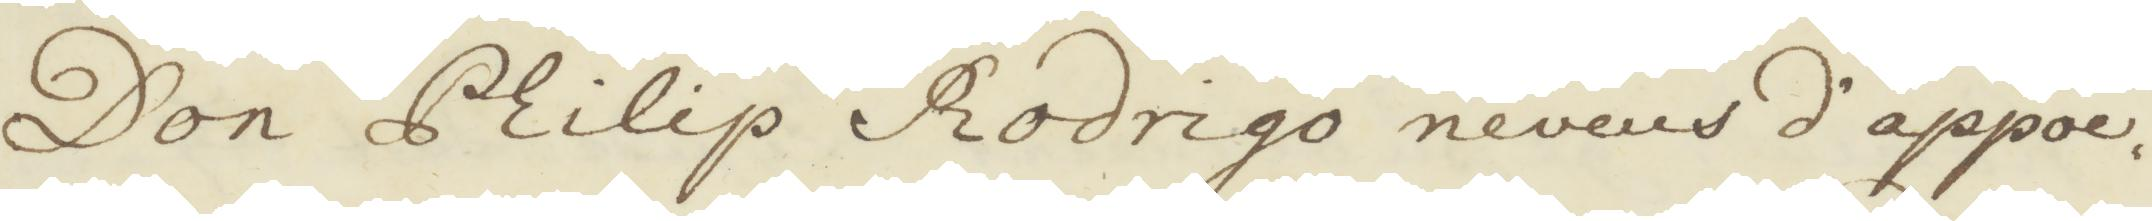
Don Philip Rodrigo nevens d’ appoe„
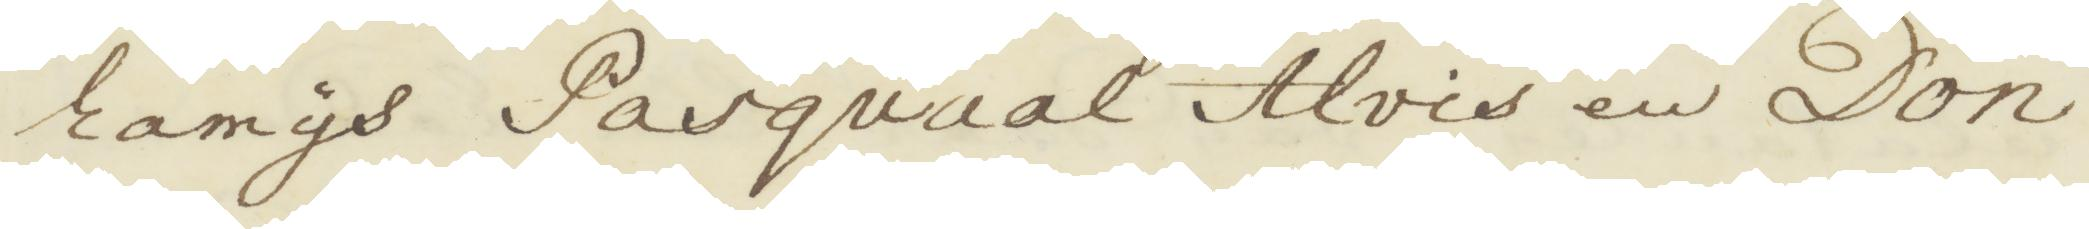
hamijs Pasquaal Alvis en Don
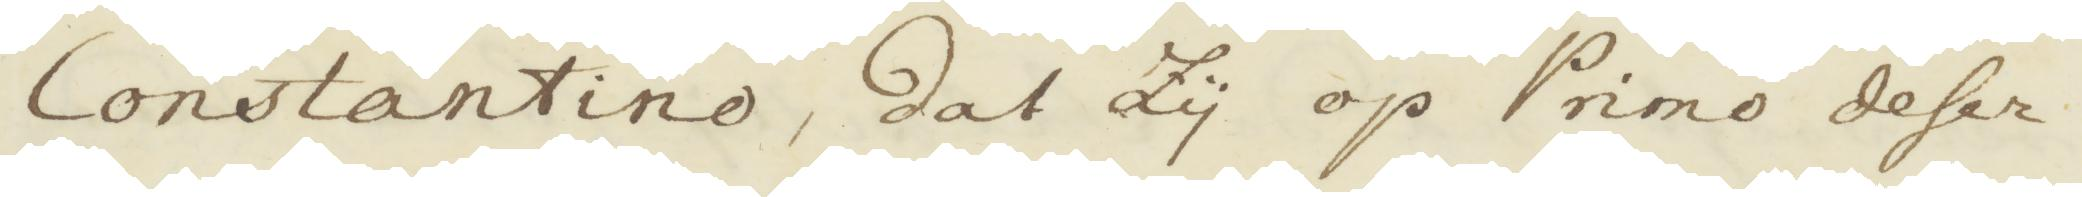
Constantino, dat zij op Primo deser
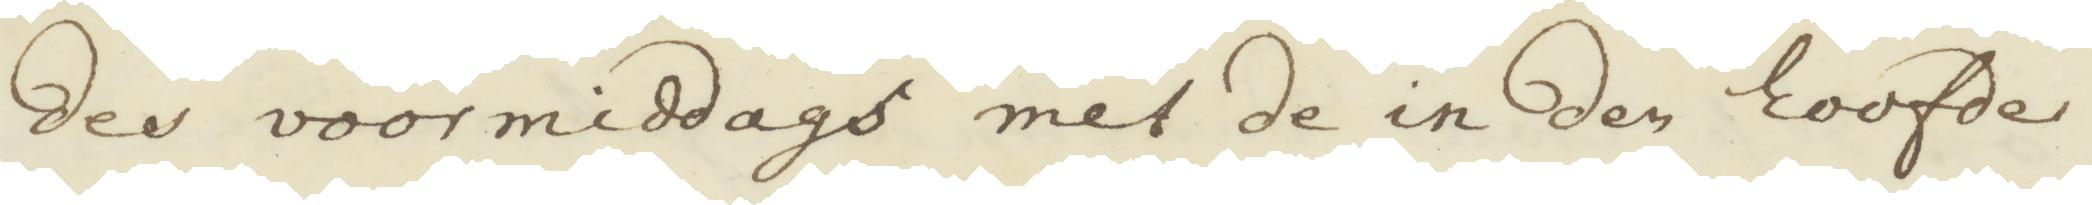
des voor middags met de in den hoofde
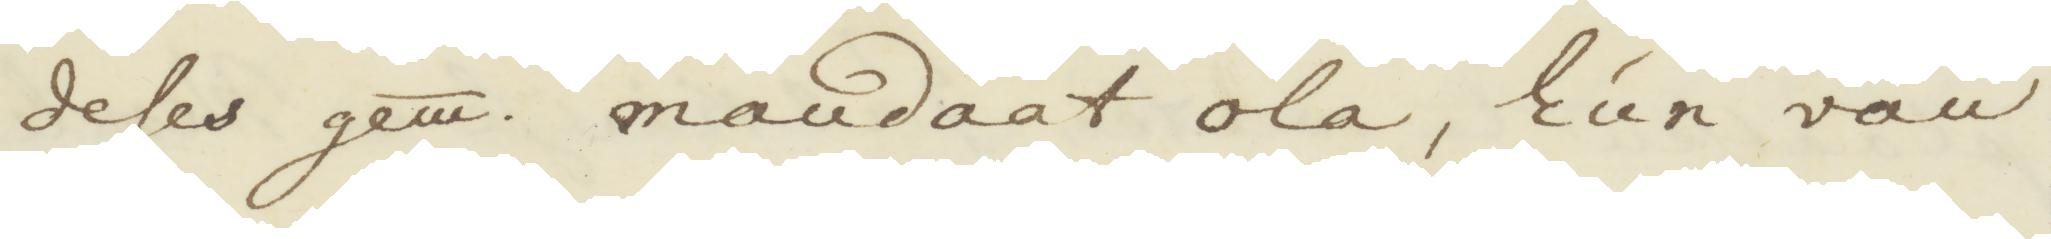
deses gem. mandaat ola, hun van
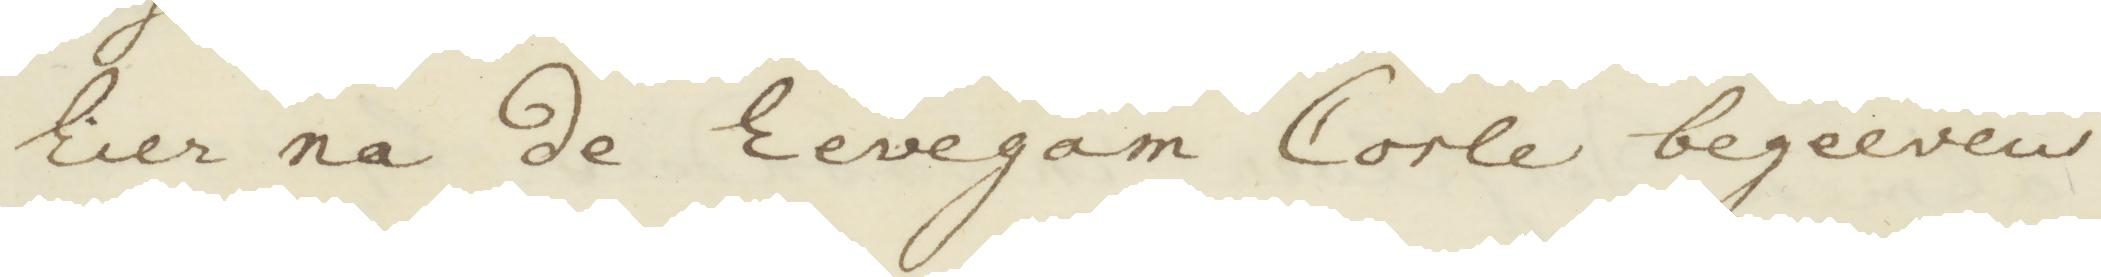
hier na de hevegam Corle begeeven
